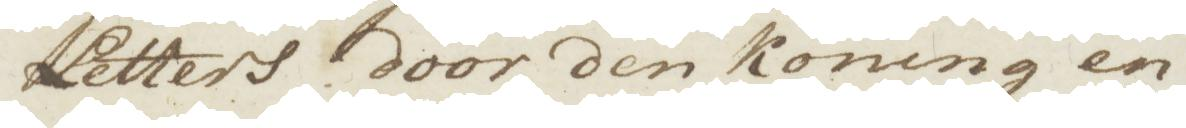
Letters door den Koning en
